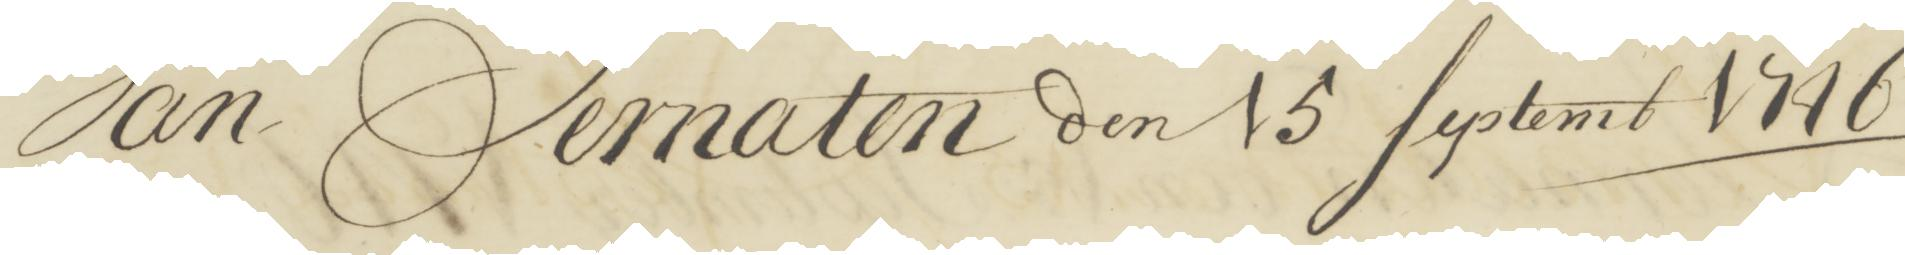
Van Ternaten den 15 septemb 1746
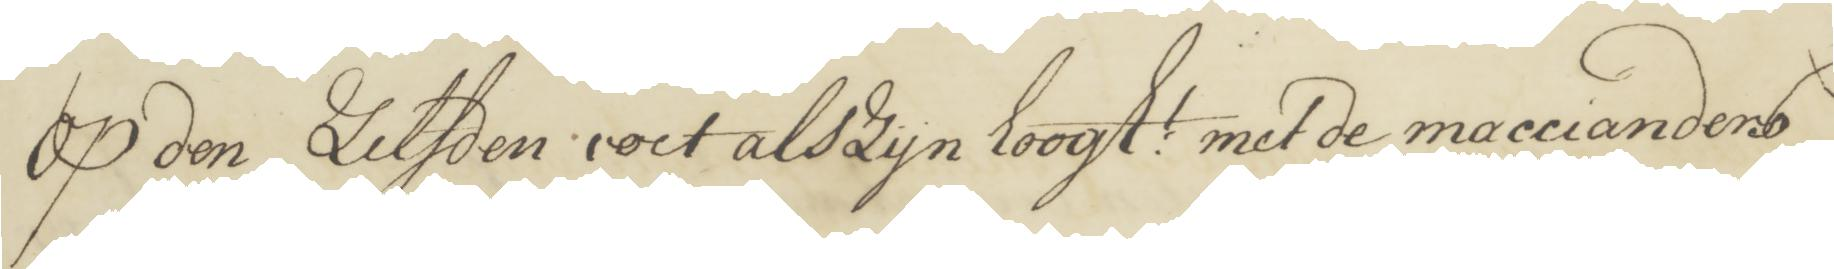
op den zelfden voet als zijn hoogh:t met de maccianders
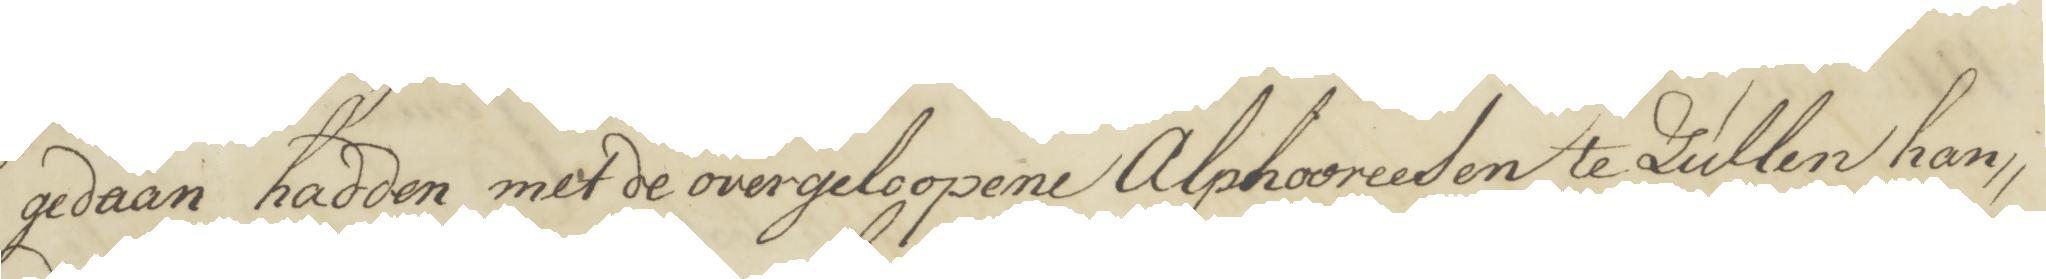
gedaan hadden met de overgeloopene Alphooreesen te zullen han„
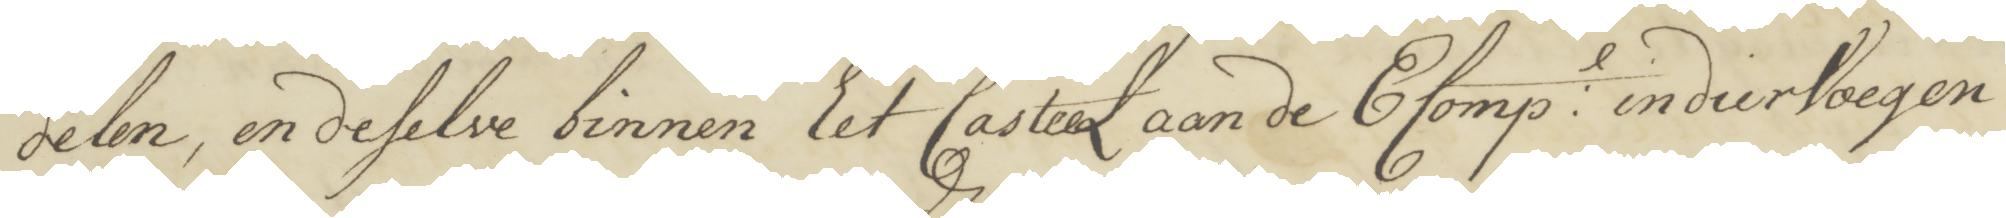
delen, en deselve binnen het Casteel aan de EComp:s in dier Voegen
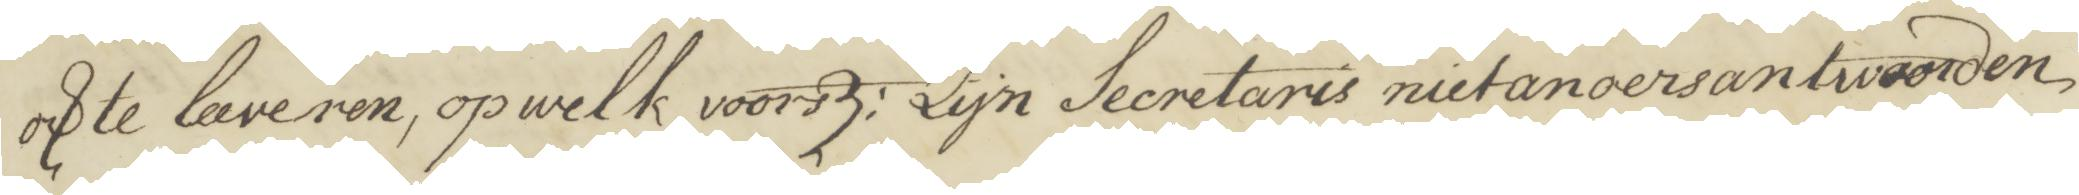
over te leeveren, op welk voorsz: zijn secretaris niet anders antwoorden
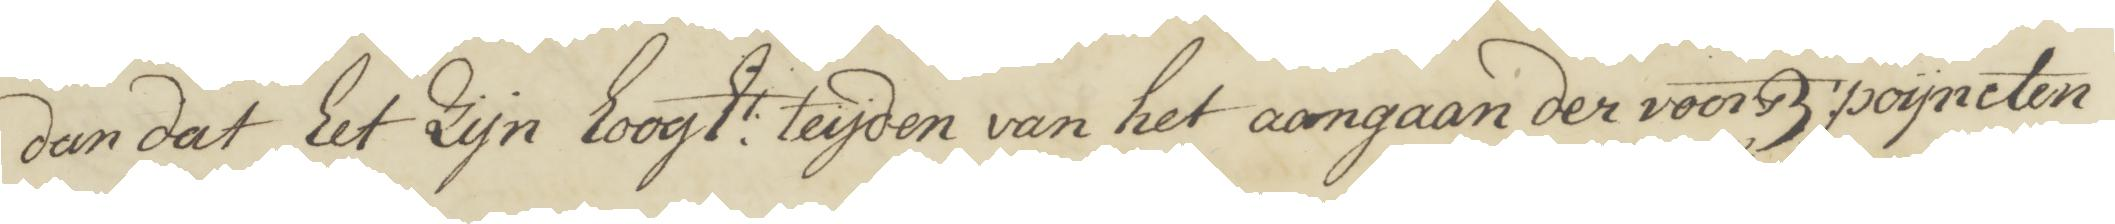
dan dat het zijn hoogh:t teijden van het aangaan der voorsz: poijncten
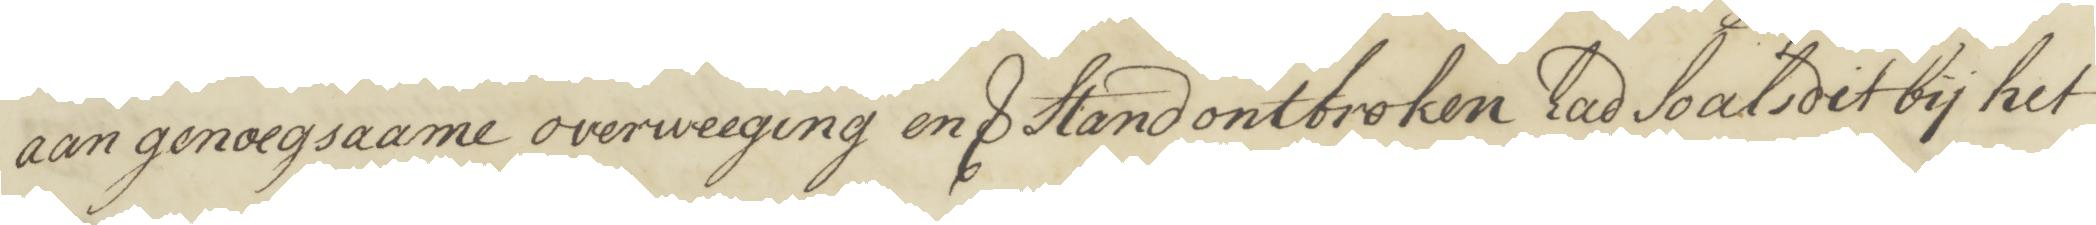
aan genoegsaame overweeging en verstand ontbroken had so al, dit bij het
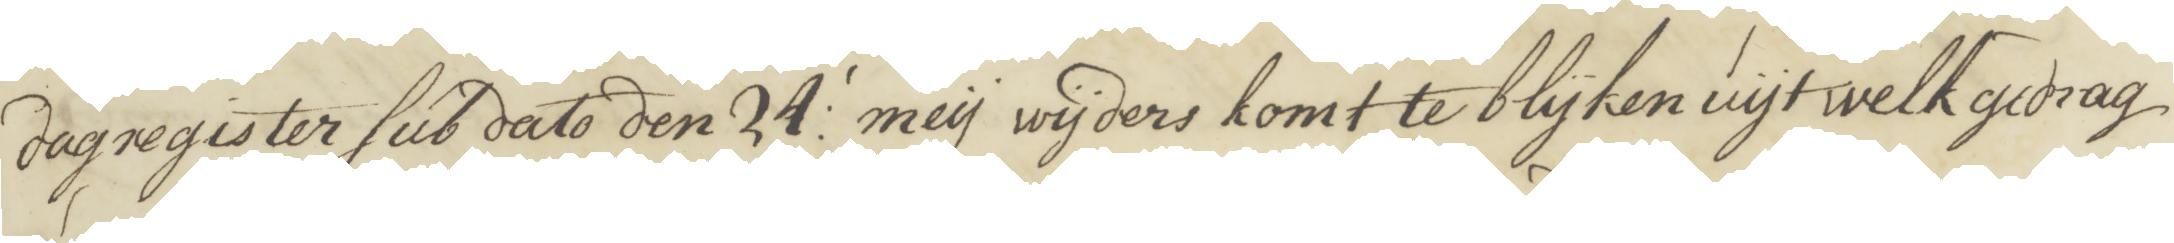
dag register sub dato den 24:' meij wijders komt te blijken uijt welk gedrag
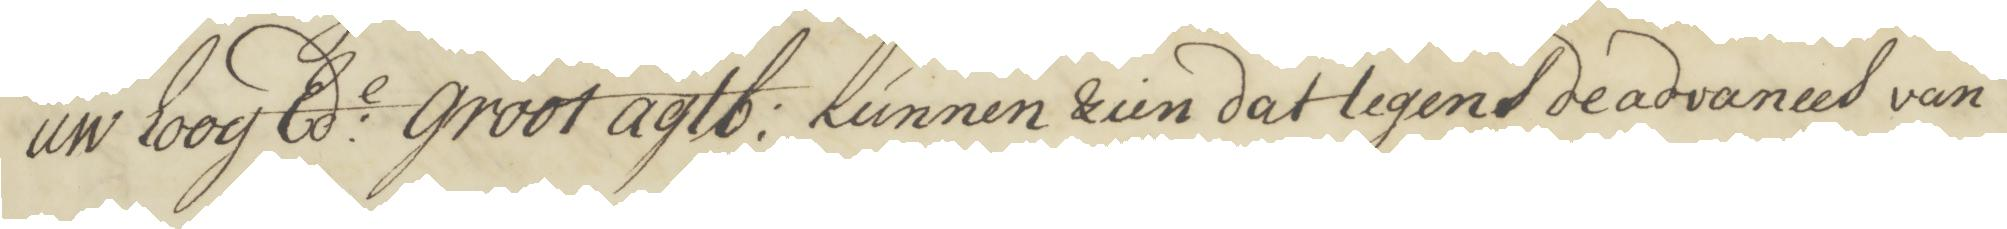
uw hoog Ed:e groot agtb: kunnen zien dat tegens de advances van
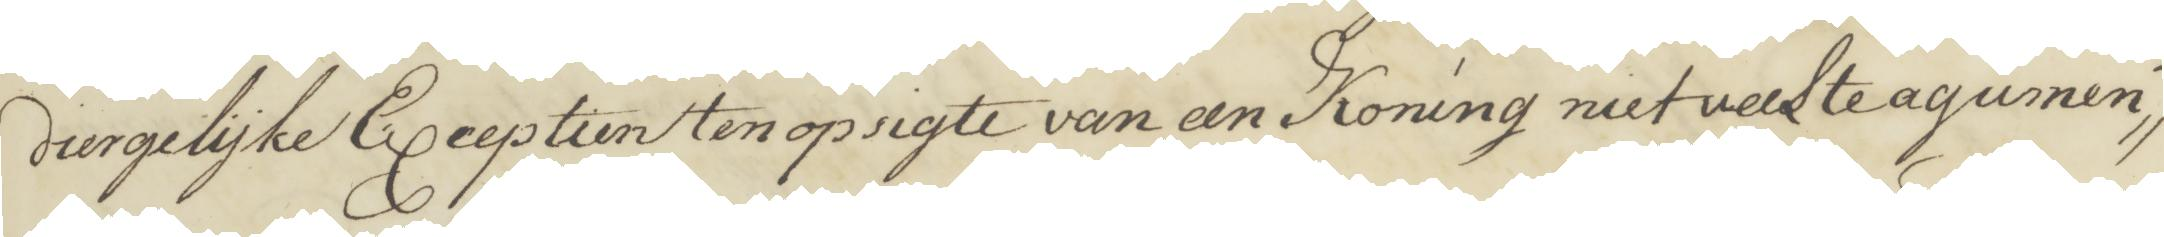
diergelijke Exceptien ten opsigte van een Koning niet veel te agumen
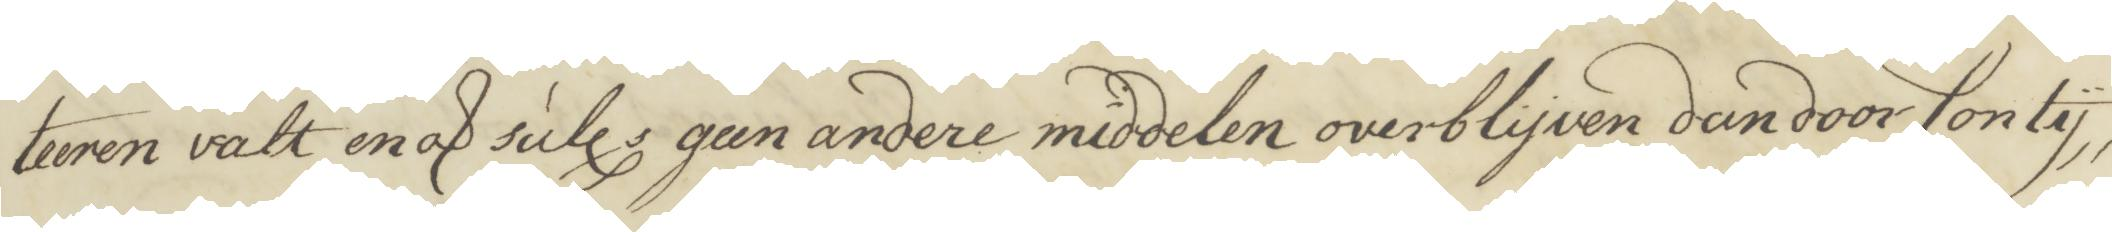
teeren valt en oversulxs geen andere middelen overblijven dan door Contij„
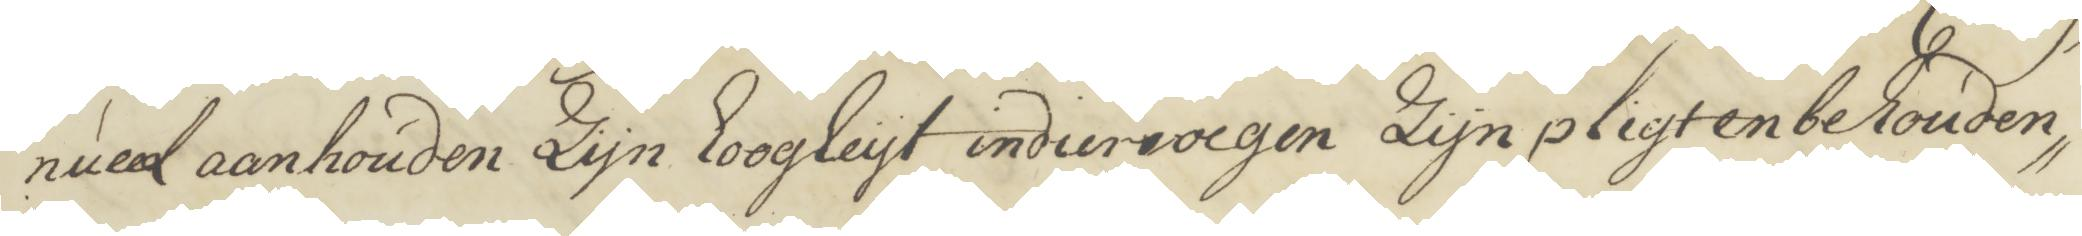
nueel aanhouden zijn hoogheijt indiervoegen zijn pligt en behouden„
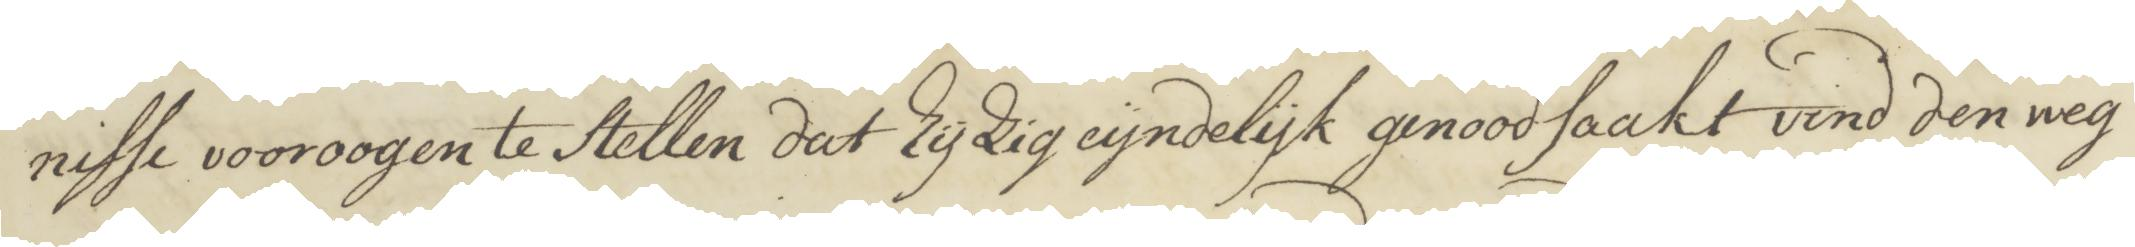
nisse vooroogen te stellen dat hij zig eijndelijk genoodsaakt vind, den weg
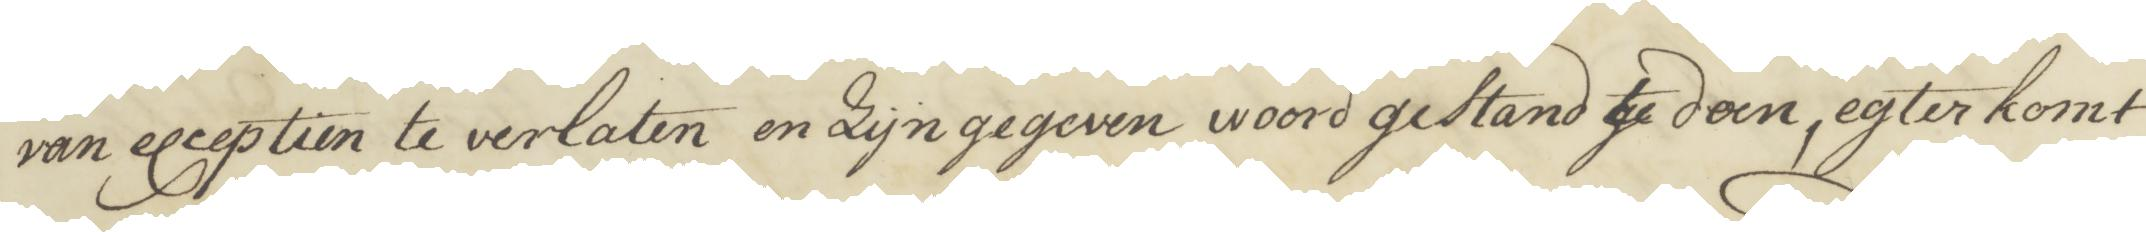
van exceptien te verlaten en zijn gegeven woord gestand te doen, egter komt
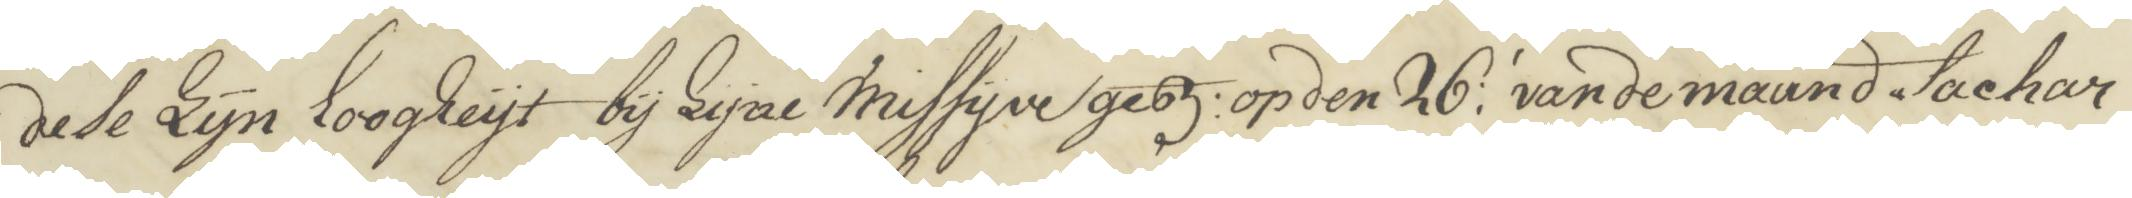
dese zijn hoogheijt bij zijne missijve gesz: op den 26:' van de maand sachar
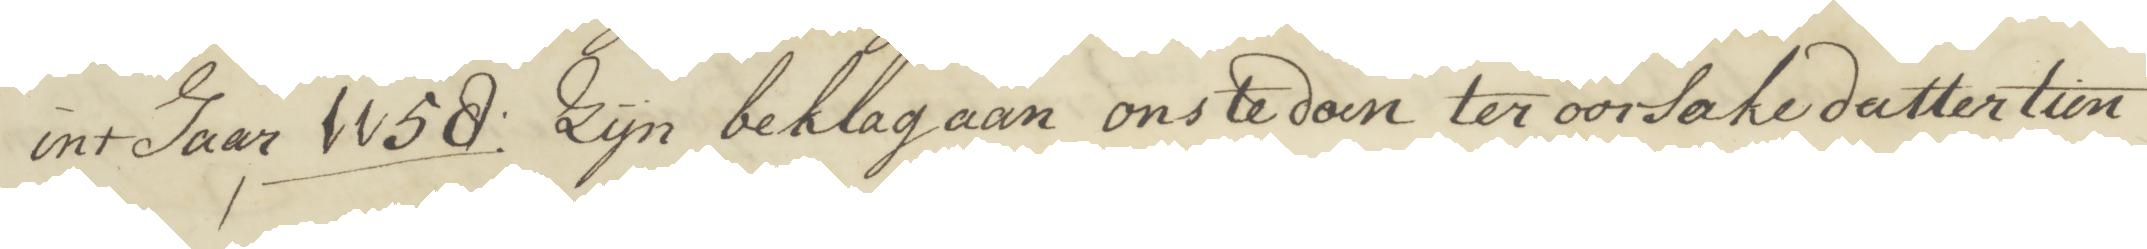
int Iaar 1158: zijn beklag aan ons te doen ter oorsake datter tien
